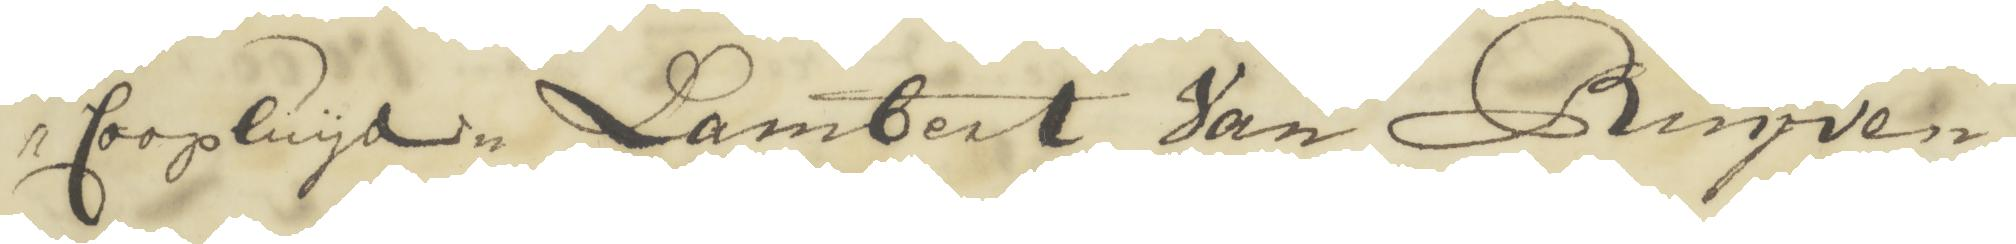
„coopluijden Lambert van Ruijven,
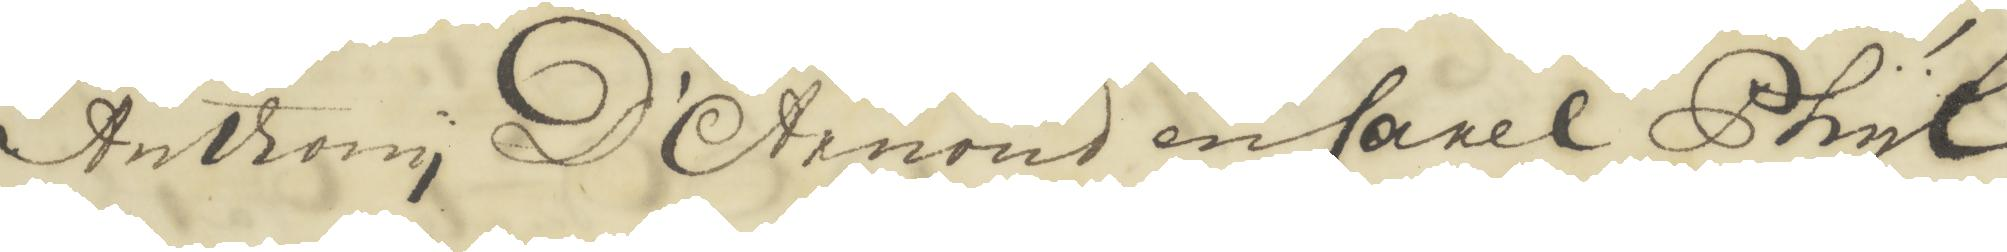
Anthonij D'Arnoud en Carel Phijl
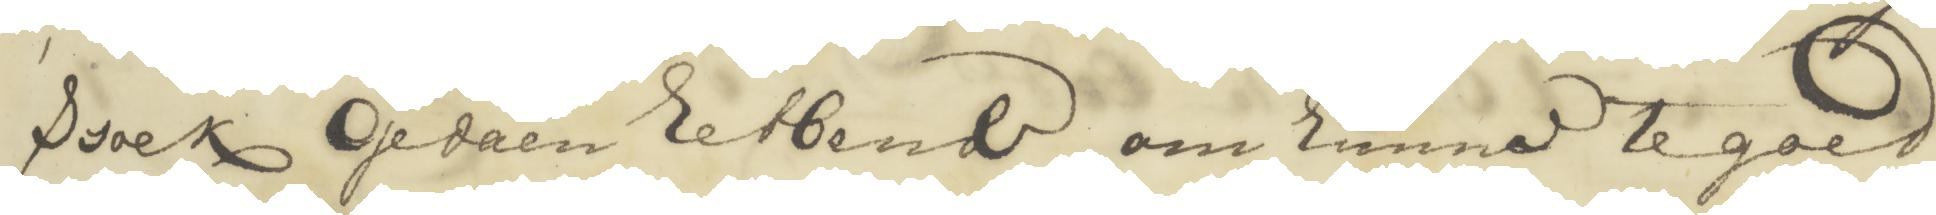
versoek Gedaen hebbende om hunne tegoed
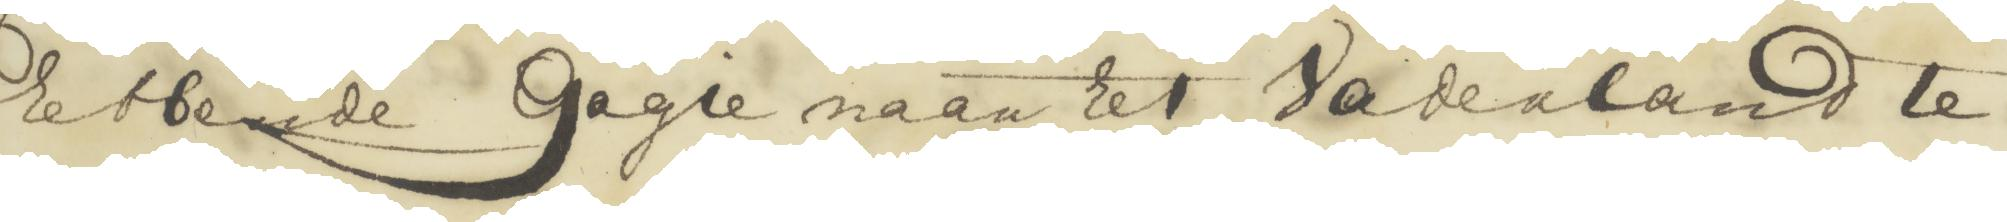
hebbende Gagie naar het vaderland te
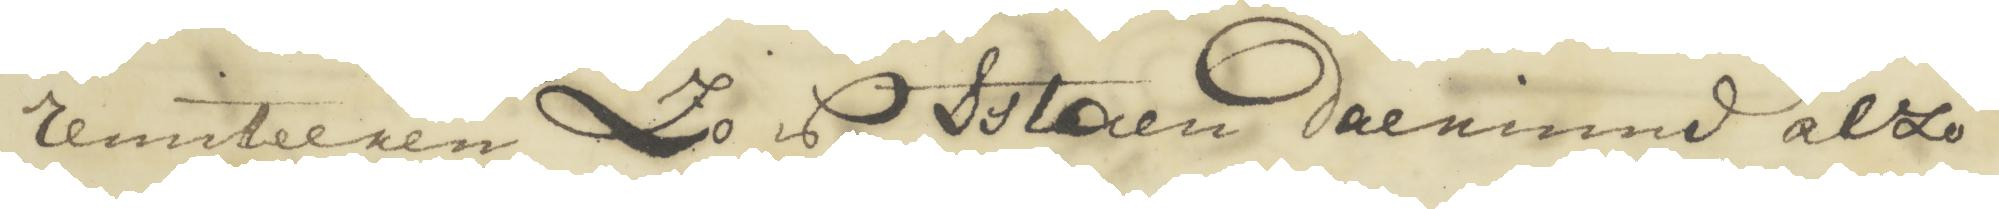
remiteeren zo is verstaen daerinne alzo
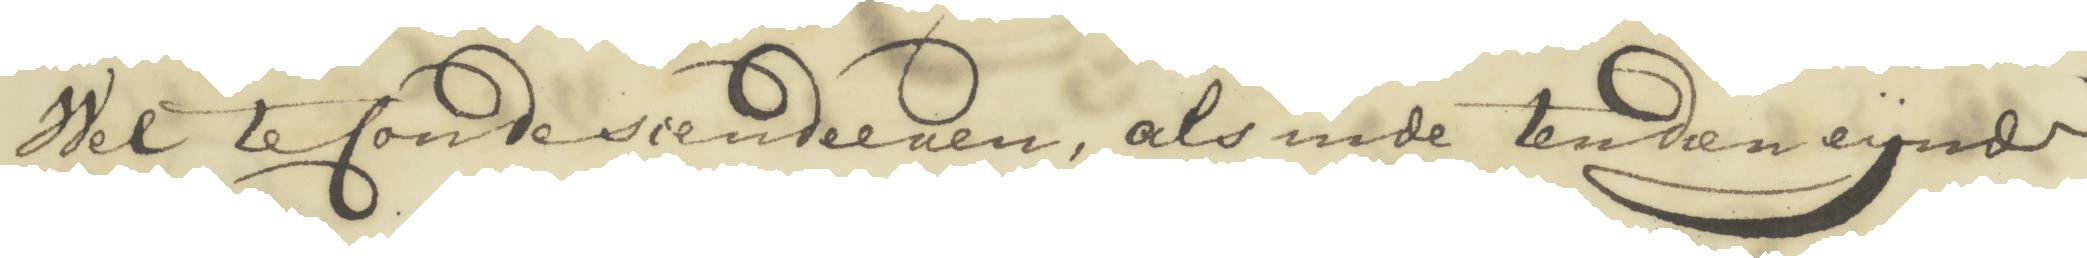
Wel te Condescendeeren, als inde ten dien eijnde
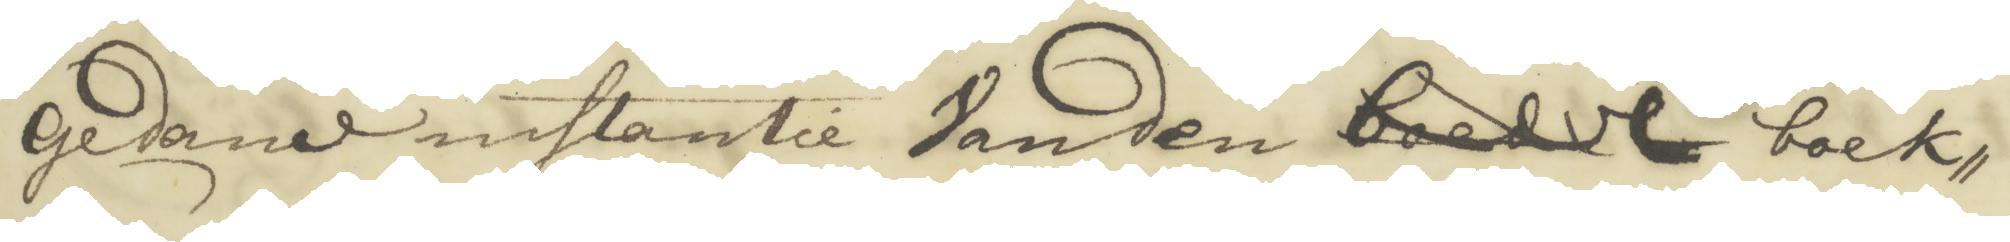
gedane instantie van den boedel boek„
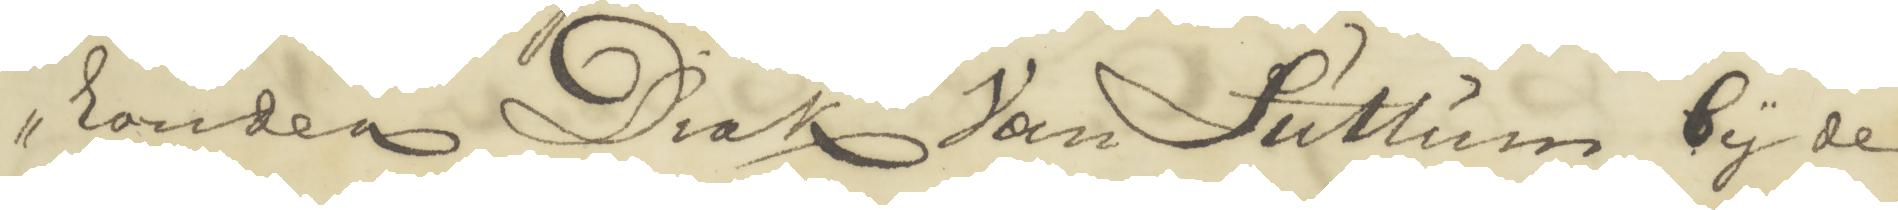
„houder Diak van Suttum bij de
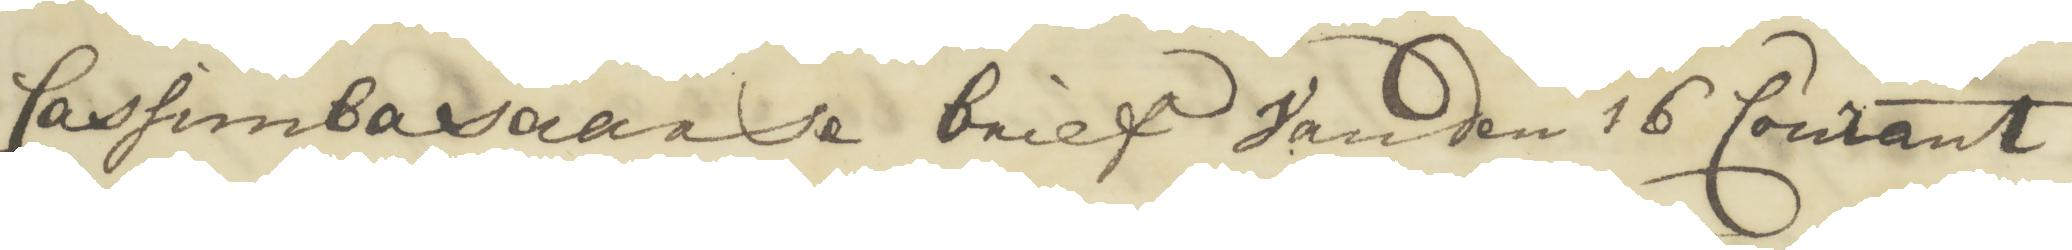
Cassimbasaarse brief van den 16 Courant
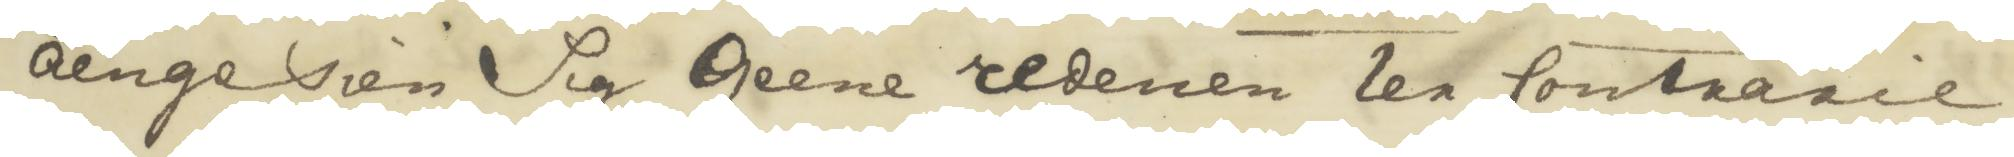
aengesien sig Geene redenen ter Contrarie
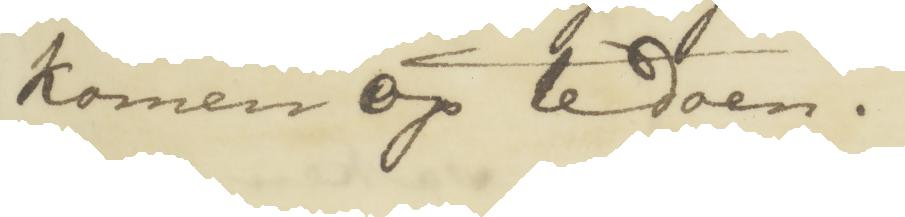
komen op te doen.
